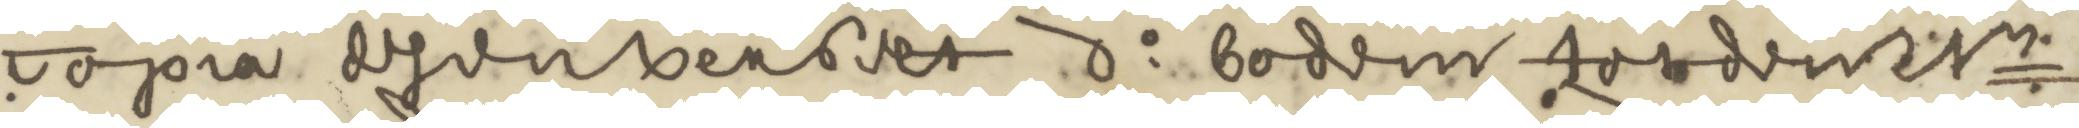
copia desen verselt d:o bodem totden W=n.
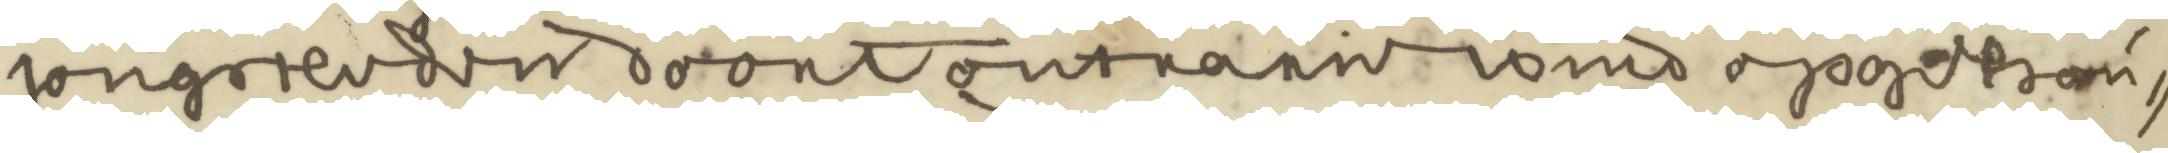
jongsten den door contrarie wind op gehou„
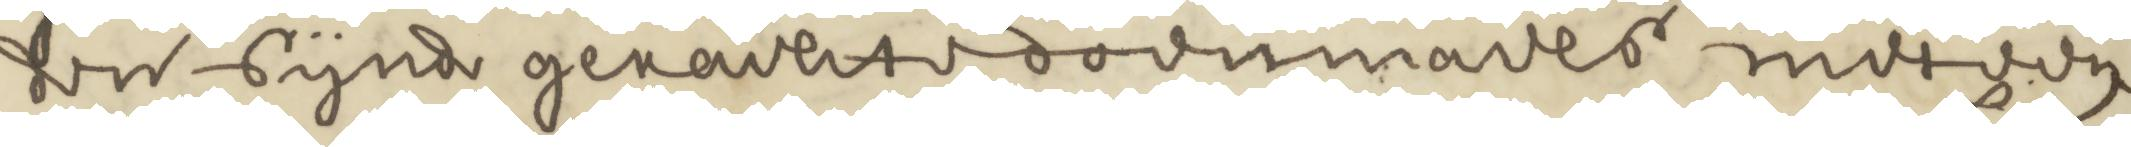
den sijnde geraekte doenmaels met een
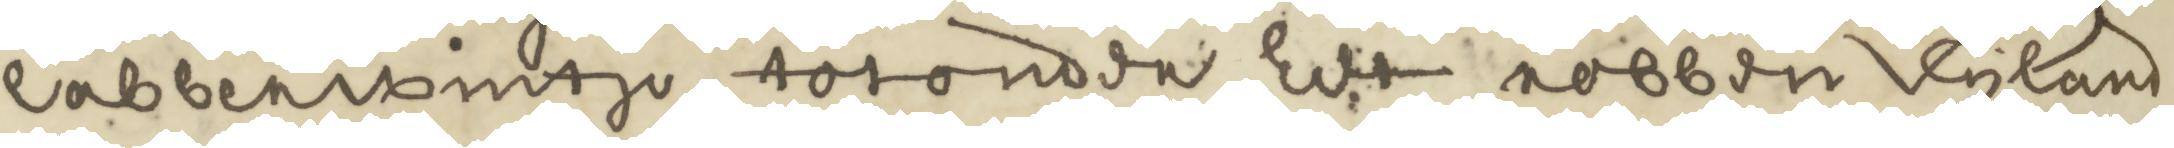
labberwintje, totonder het robben Eijland
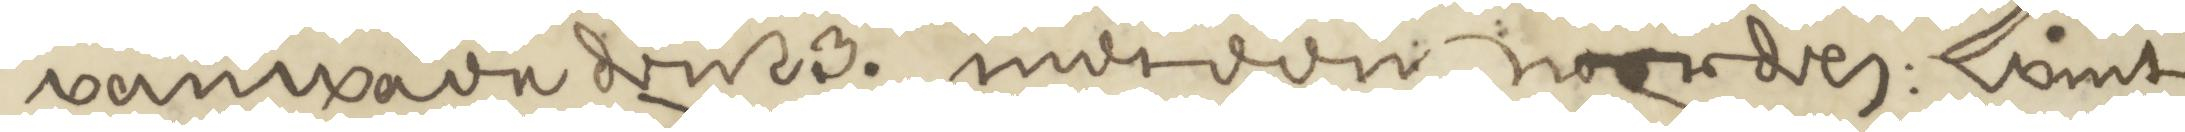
van waer den 23. met een noordelijk wint
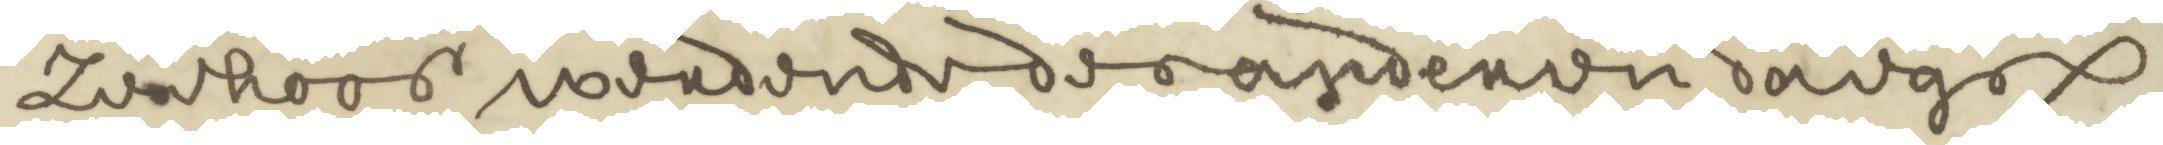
zeehoos werdende des anderen daegs
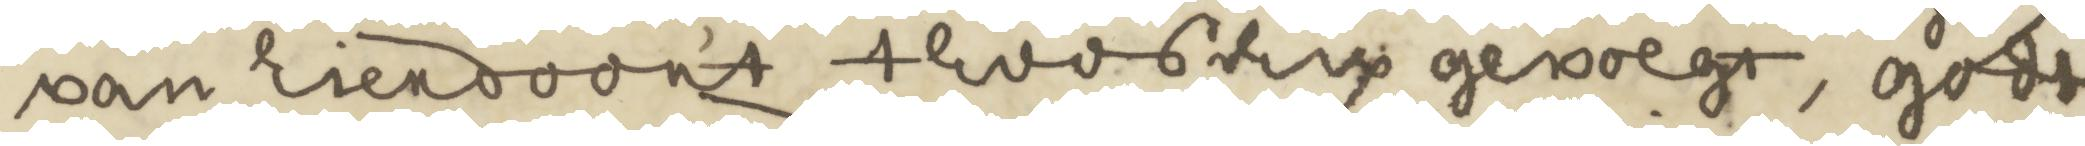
van hierdoor 't theeschip gevolgt, godt
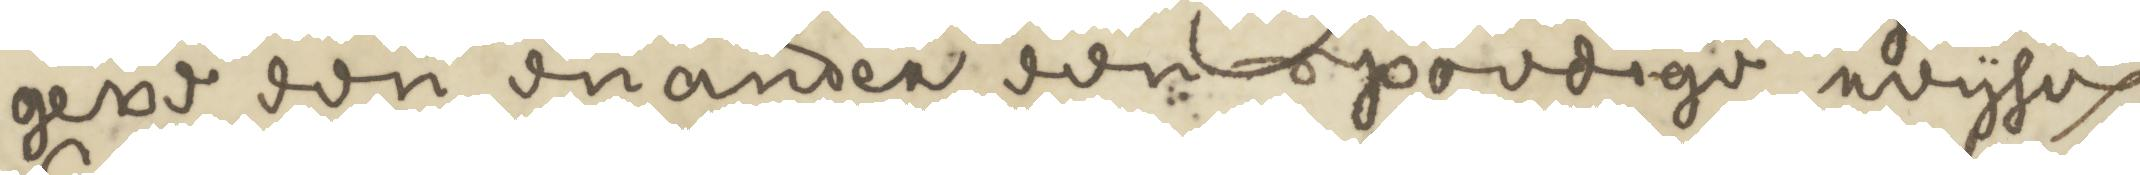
geve een en ander een spoedige reijse
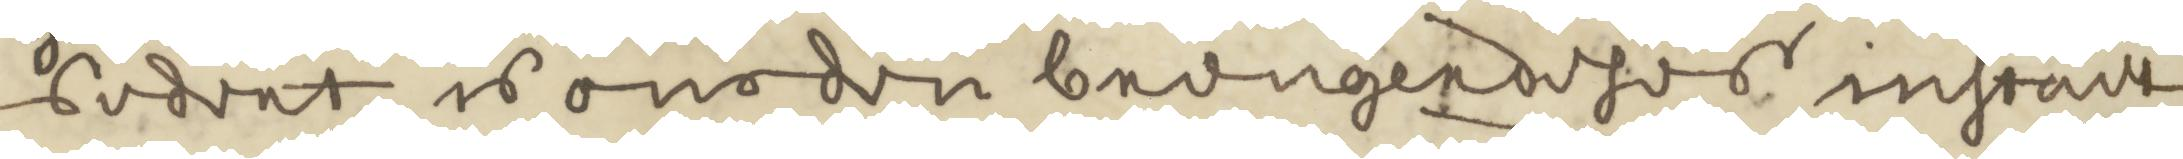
sedert is ons den brenger deses instaet
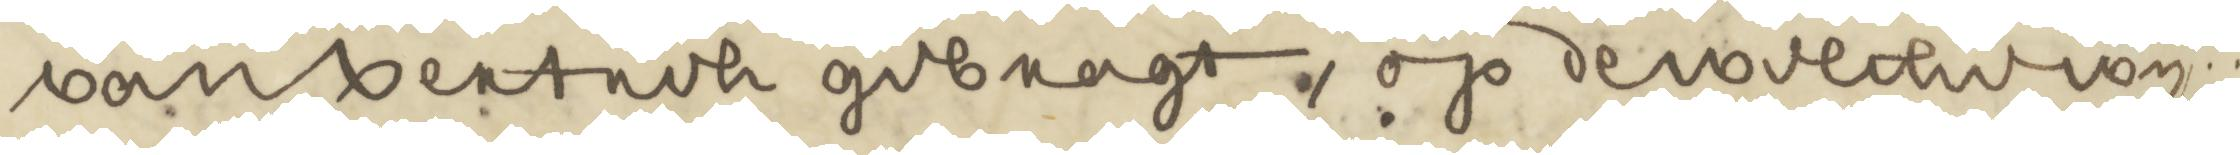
van vertrek gebragt, op dewelche wij
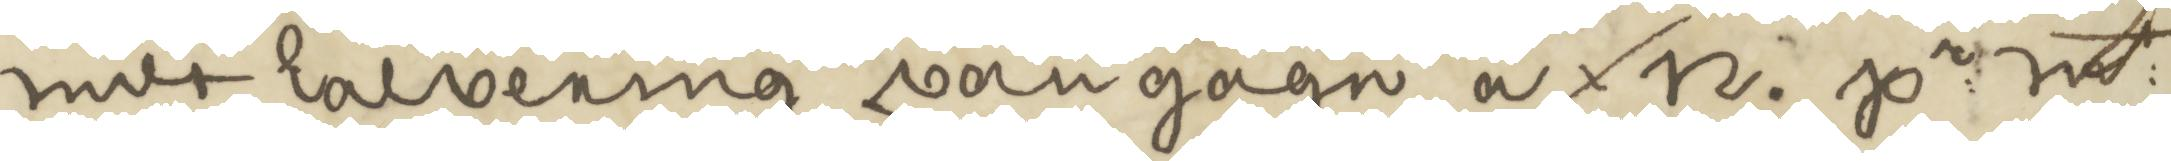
met halvering van gagie a ƒ 12. p:r w:t
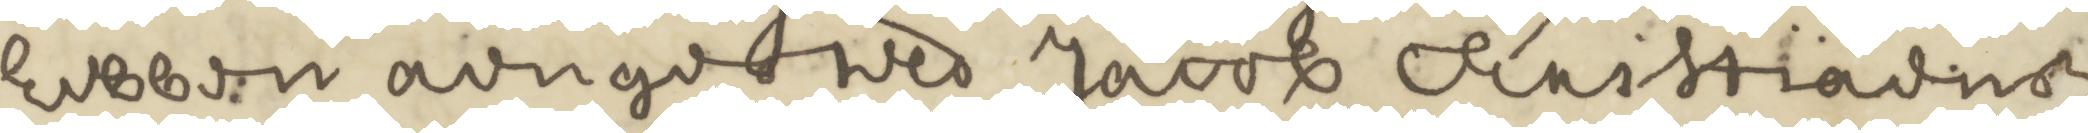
hebben aen gesteld Jacob Christiaens
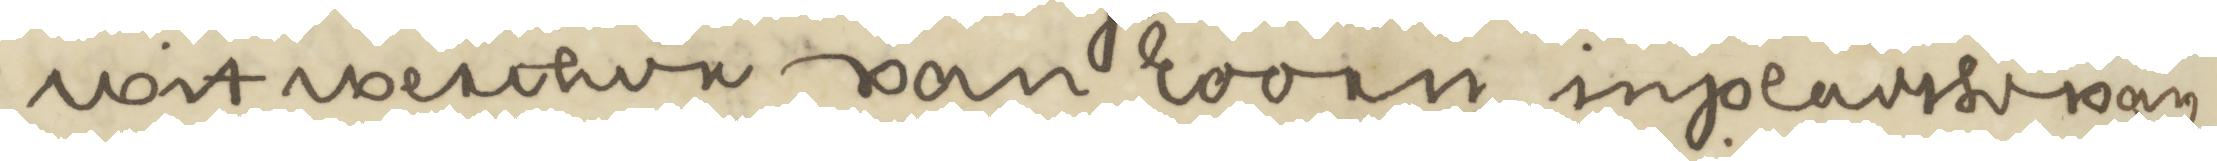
wit werdhen van hoorn inplaetse van
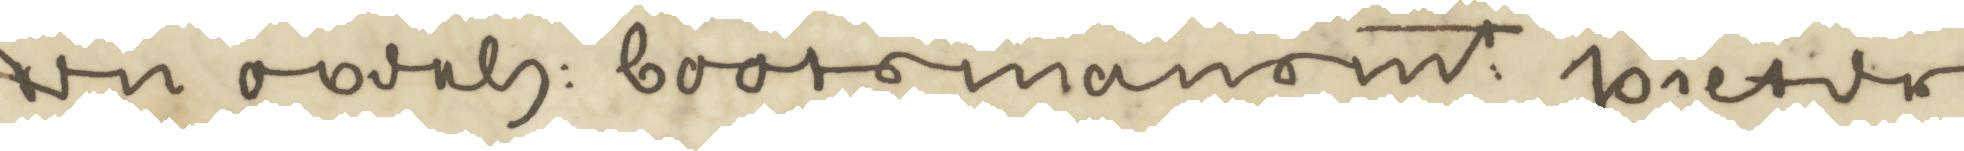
den overls: bootsmans m:t pieter
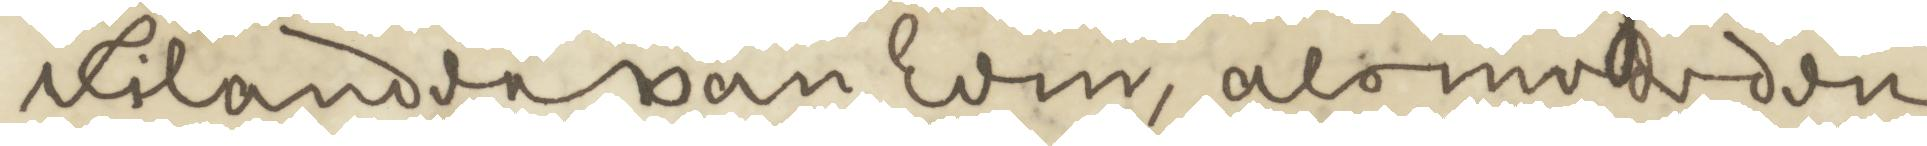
Eilander van hem, als mede den
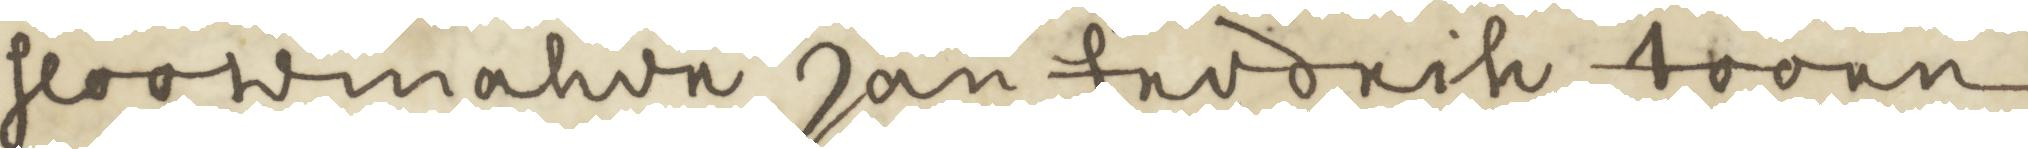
slootemaker Jan Fredrik toorn
